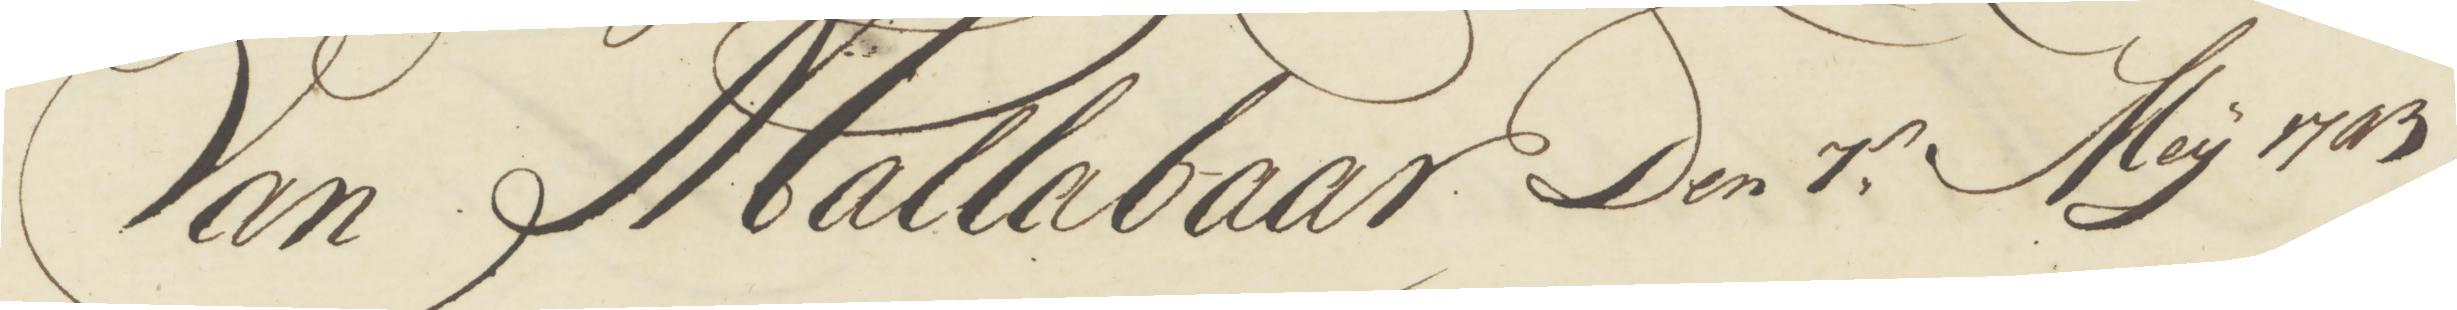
Van Mallabaar Den 7' Meij 1743
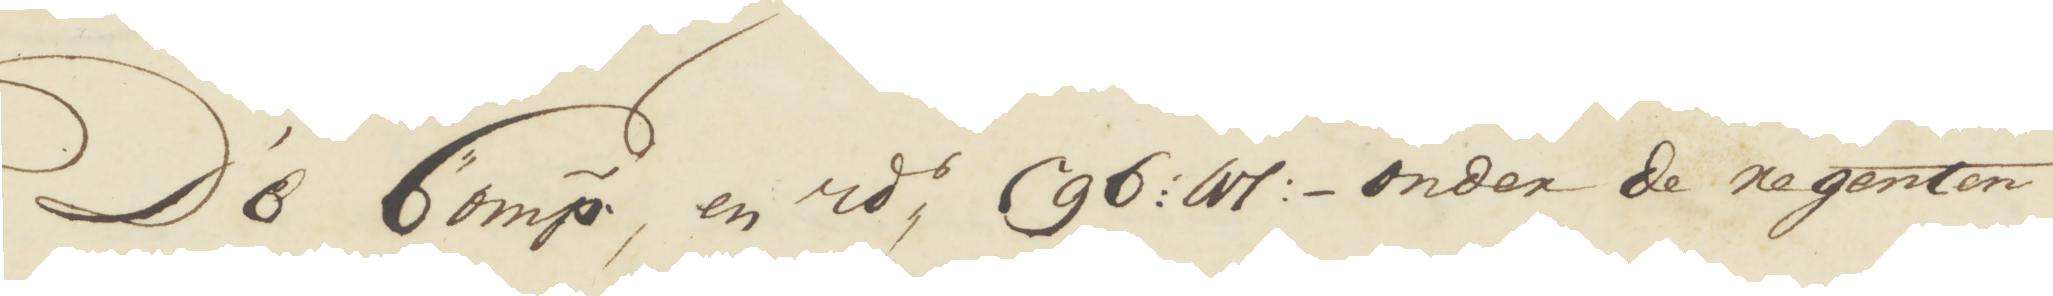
D’ E Comp:s, en rd„s 596:47:- onder de regenten
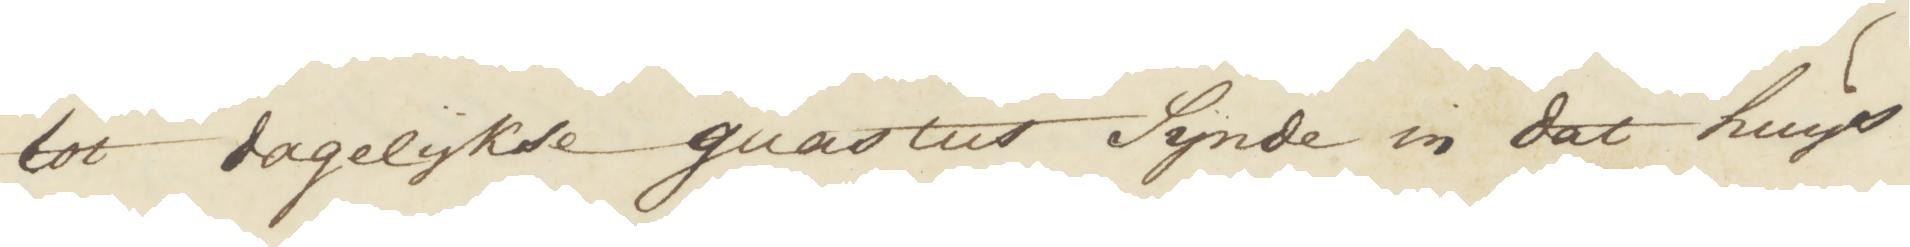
tot dagelijkse guastus sijnde in dat huys
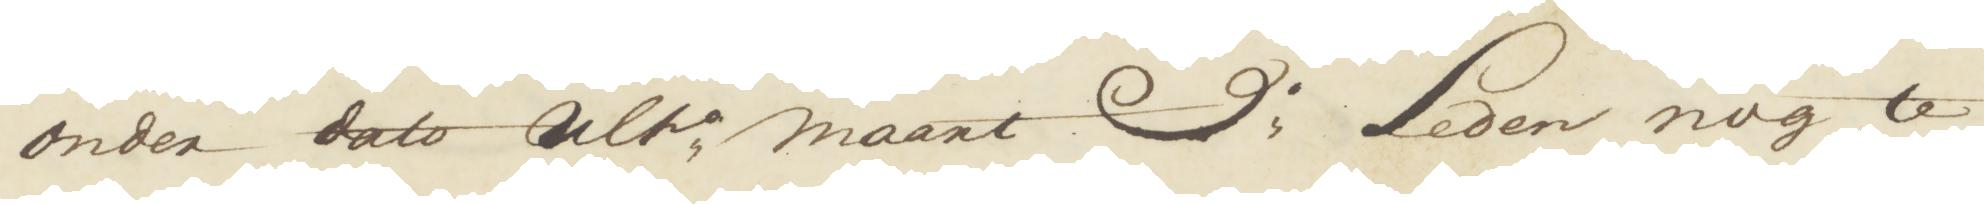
onder dato ult„o maart I:o Leden nog te
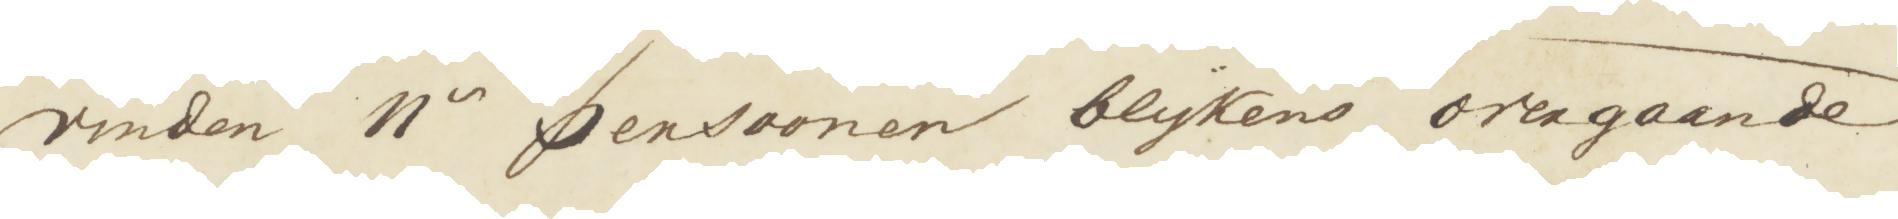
vinden 11~ persoonen blijkens overgaande
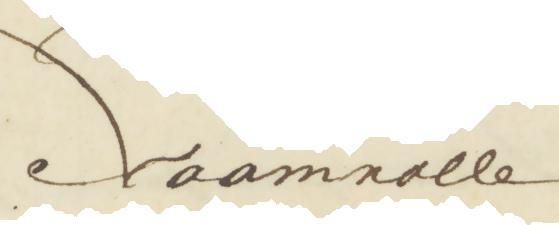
Naamrolle
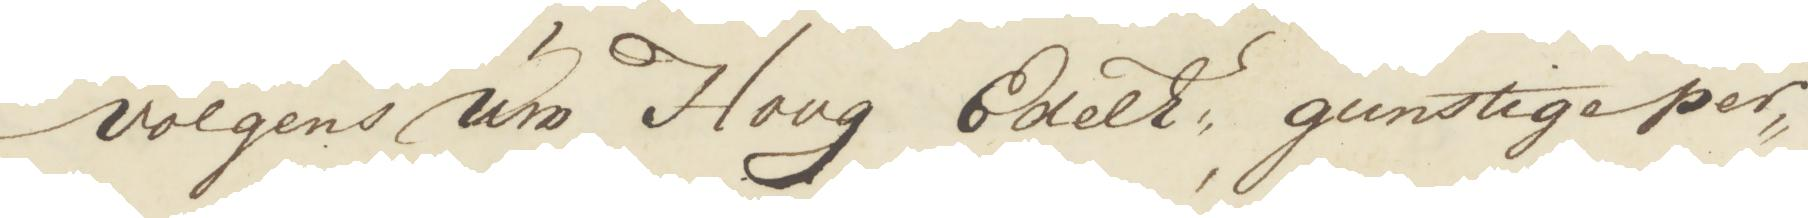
Volgens uw Hoog Edelh„s gunstige per„
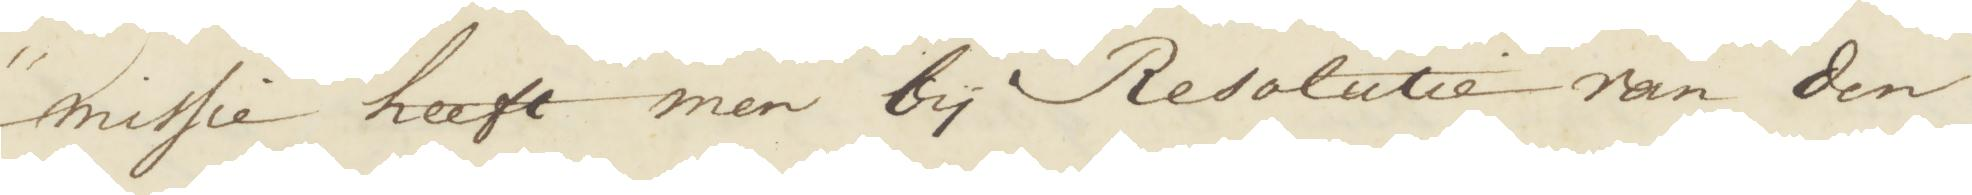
„missie heeft men bij Resolutie van den
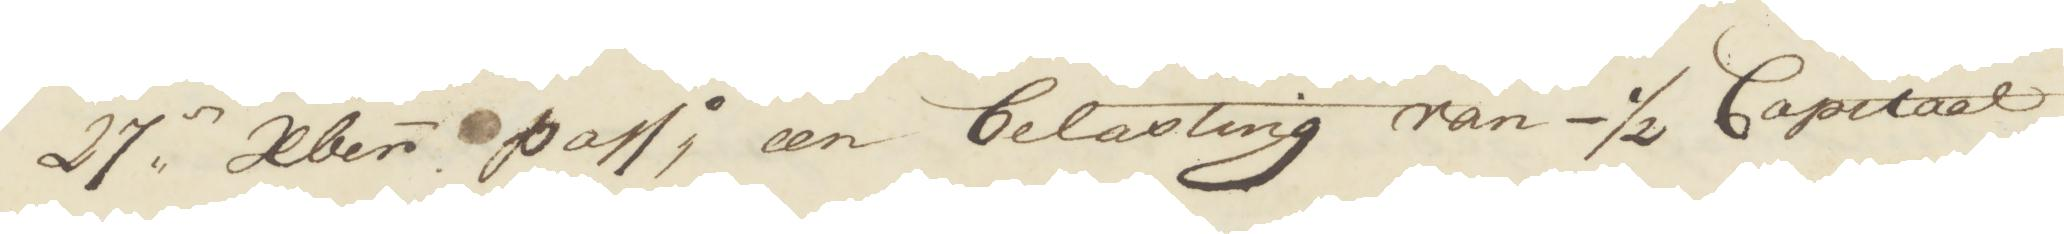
27„s Xber pass„o een belasting van –½ Capitaal
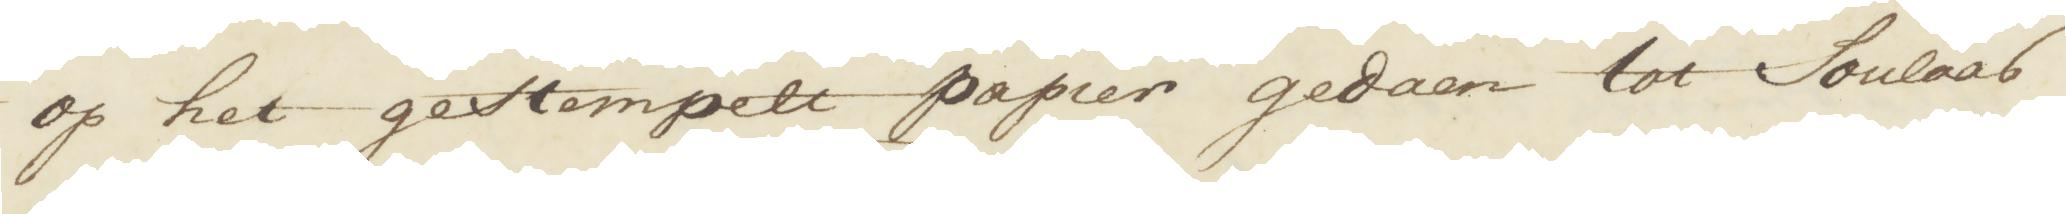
op het gestempelt papier gedaen tot soulaas
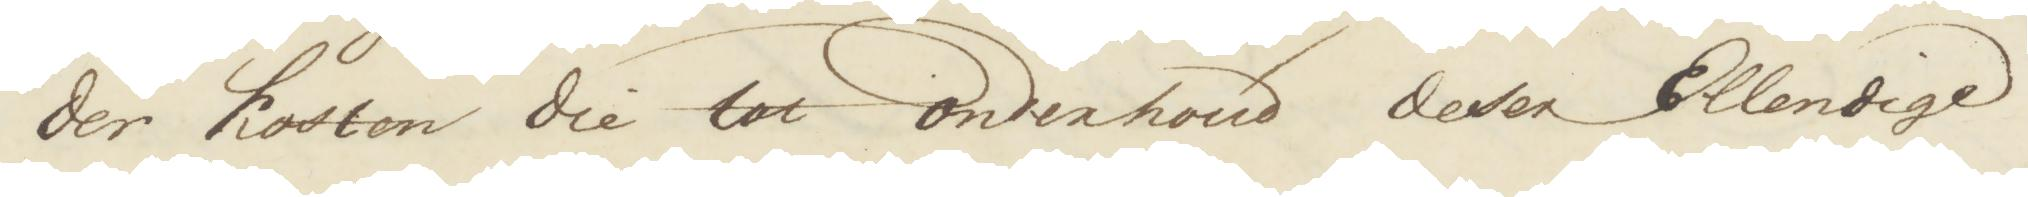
der kosten die tot onderhoud deser Ellendige
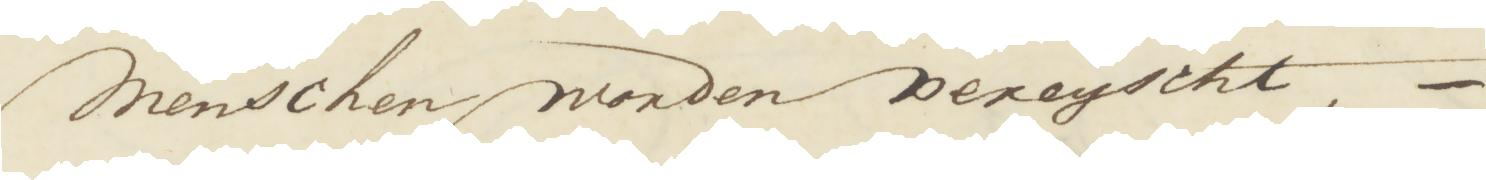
menschen worden vereijscht,-
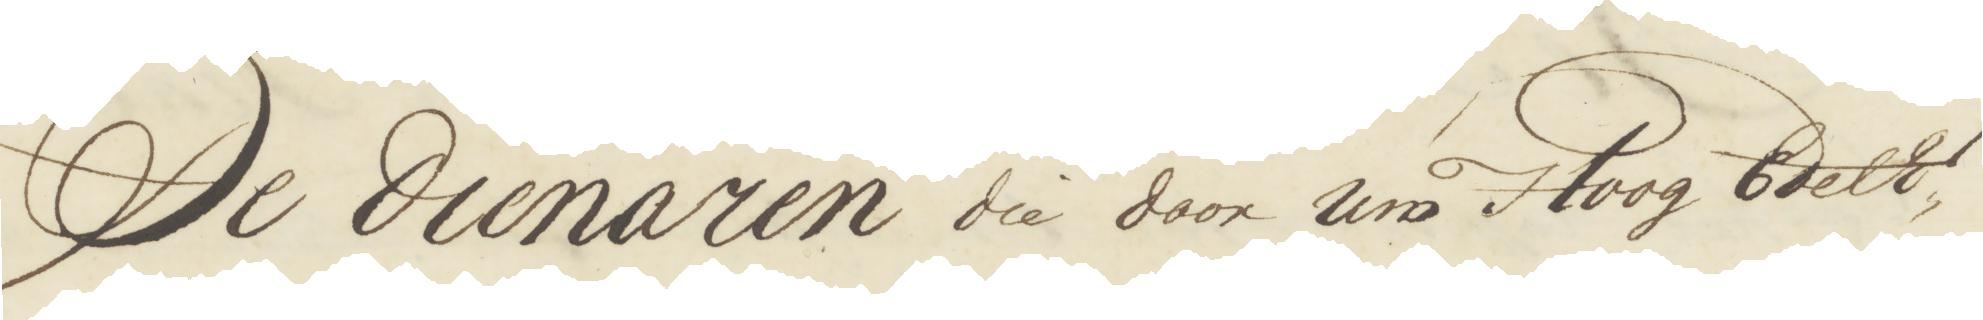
De dienaren die door uw Hoog Edelh„t
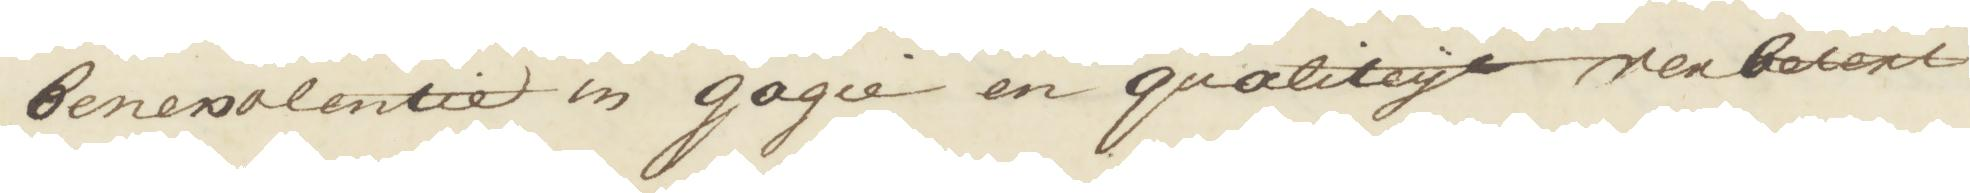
benevolentie in gagie en qualiteijt verbetert
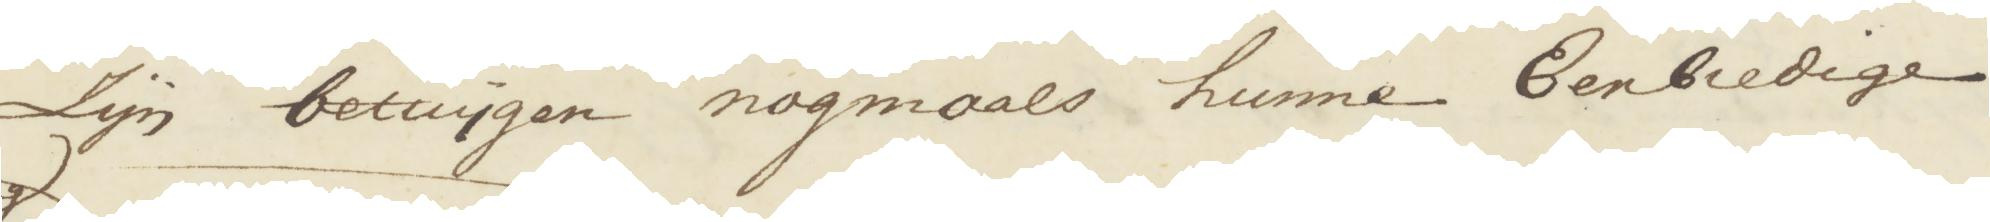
zijn betuijgen nogmaals hunne Eerbiedige
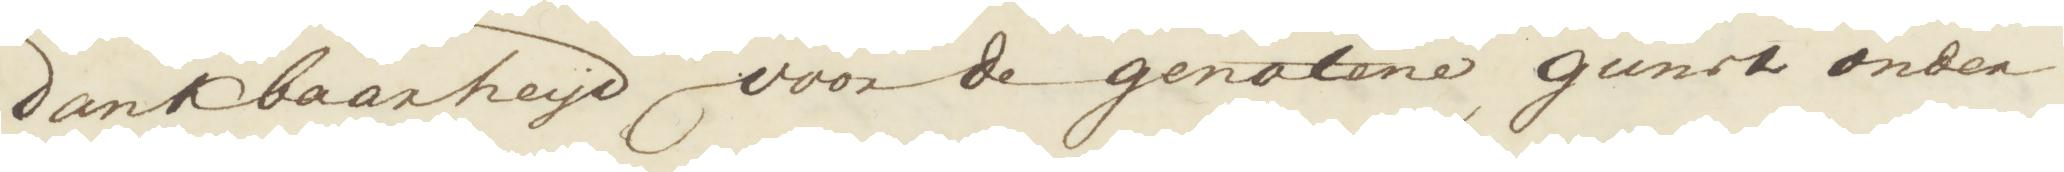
dankbaarheijd voor de genotene gunst onder
